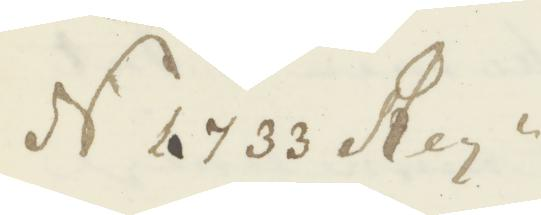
N 4733 Reg
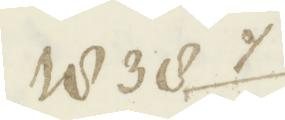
1838 7
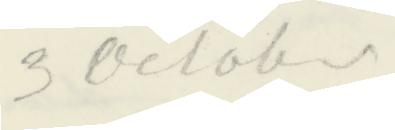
3 October
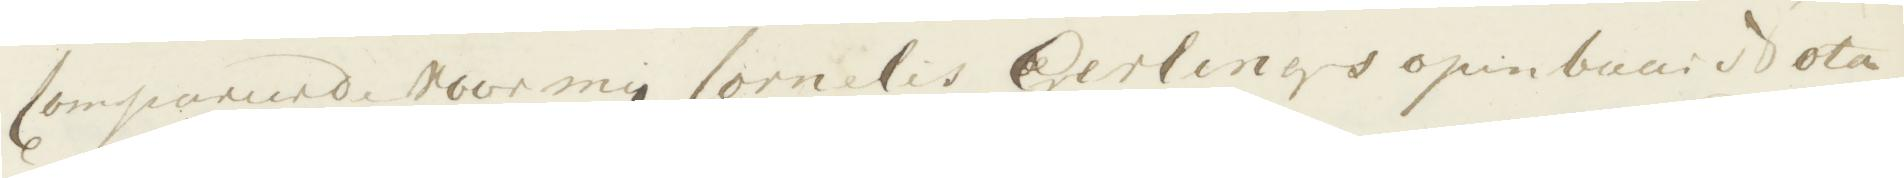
Compareerde voor mij Cornelis Gerlings openbaar Nota
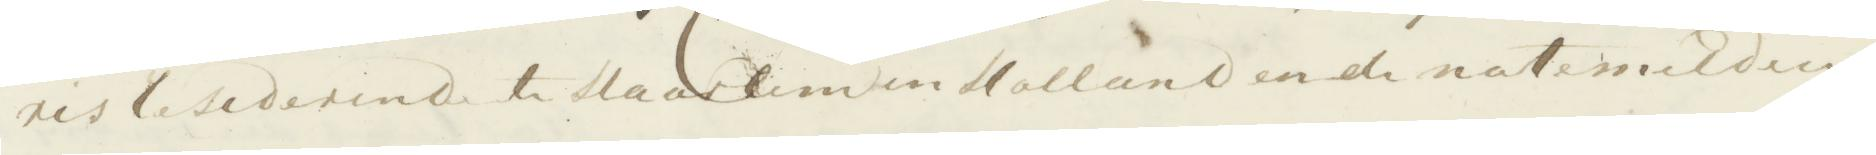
ris Residerende te Haarlem in Holland en de na te melden
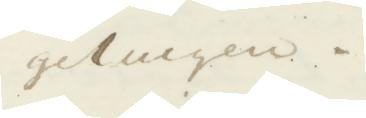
getuigen-
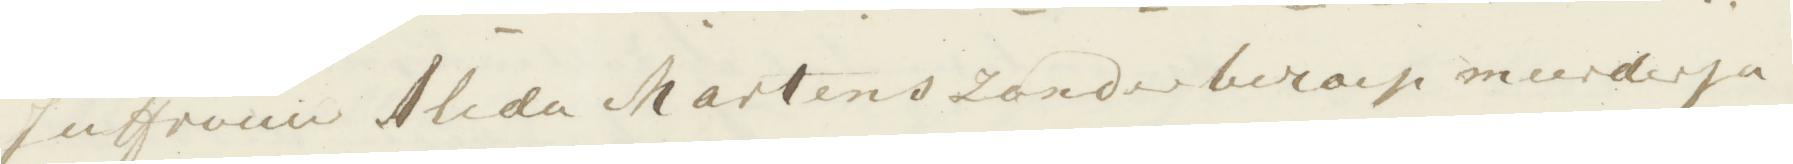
Juffrouw Alida Martens zonder beroep meerderja
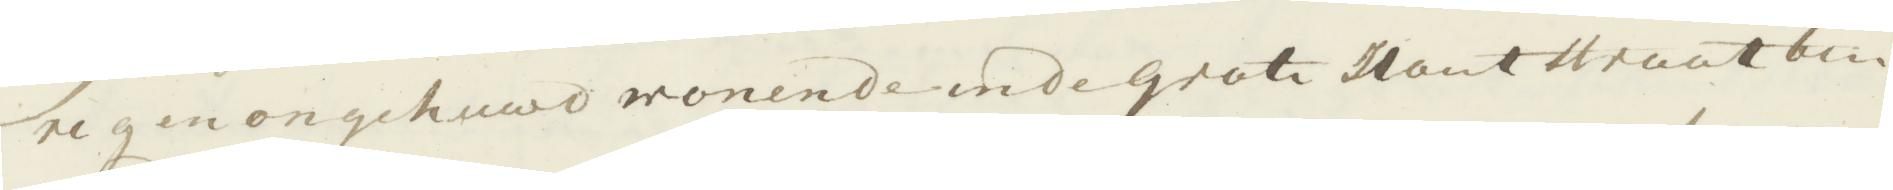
rigen ongehuwd wonende in de Grote Houtstraat bin
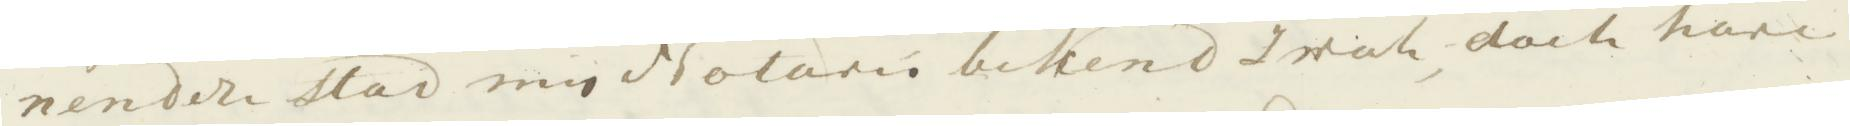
nen deze stad mij Notaris bekend Zwak, doch hare
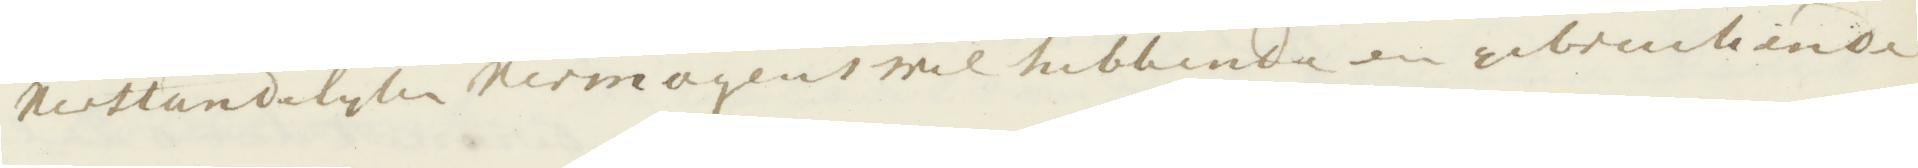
verstandelyke vermogens wel hebbende en gebruikende
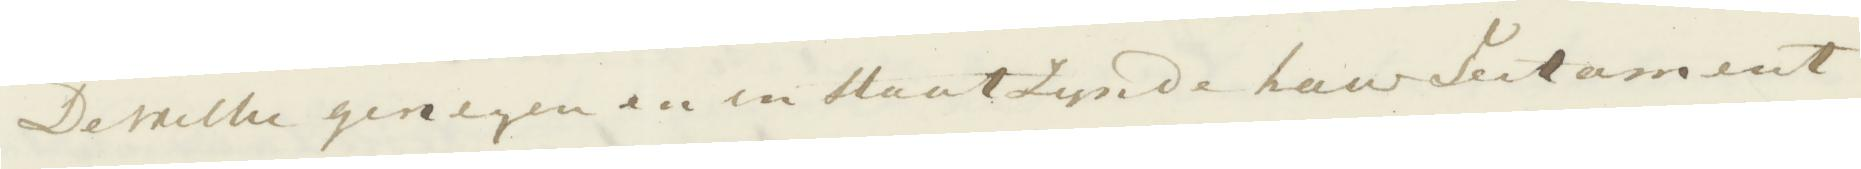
Dewelke genegen en in Staat Zynde haar Testament
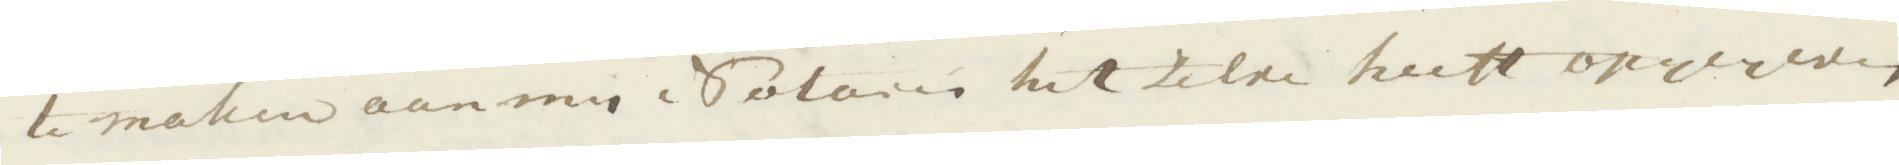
te maken aan mij Notaris het zelve heeft opgegeven
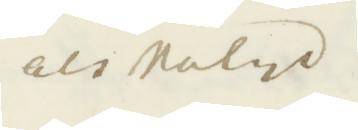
als valyd
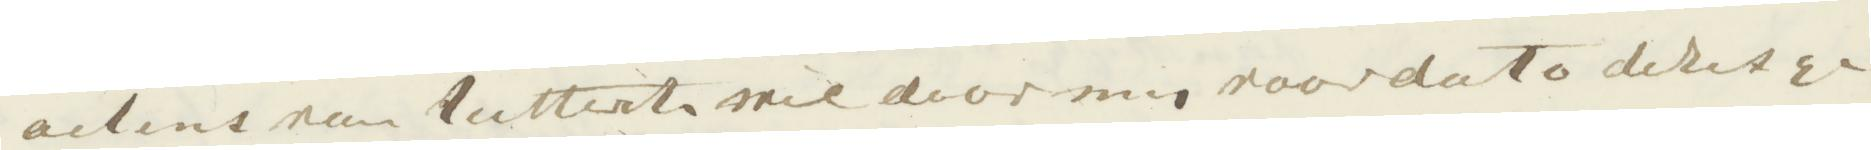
actens van Uitterste wil door mij voor dato dezes ge
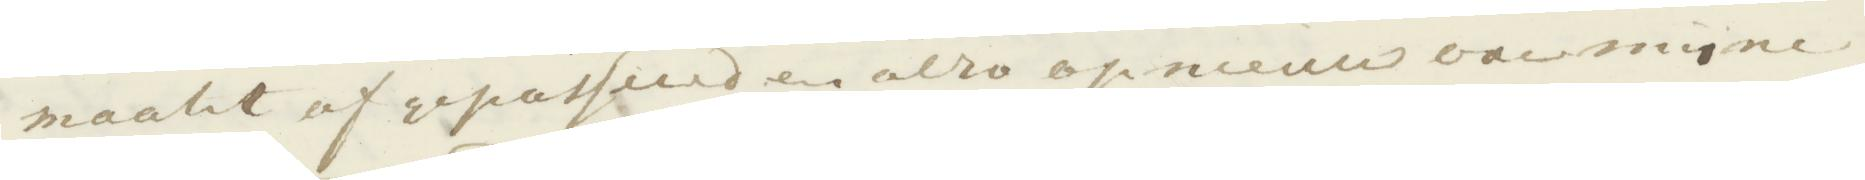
maakt of gepasseerd en alzo op nieuw voor mijne
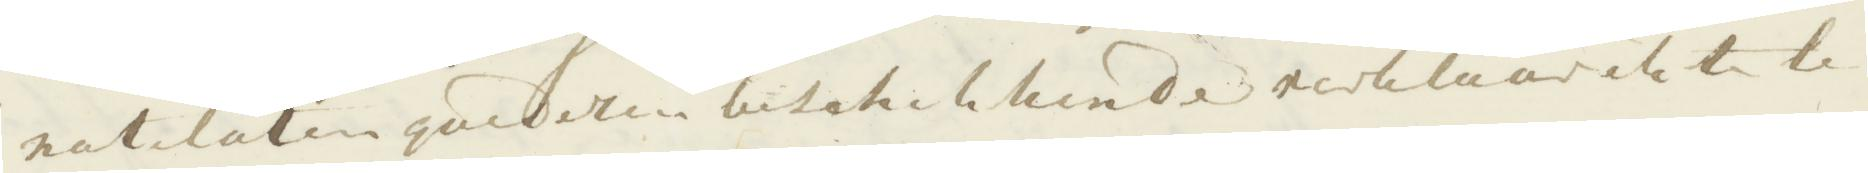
na te laten goederen beschikkende verklaarde te le
